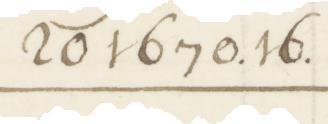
201670.16.
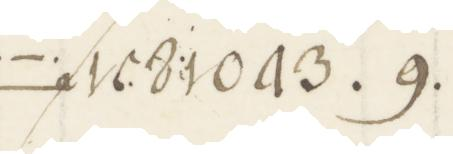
-. ƒ15.81043.9.
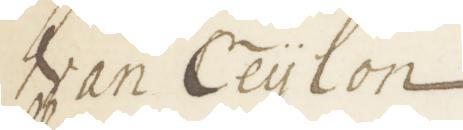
Van Ceijlon
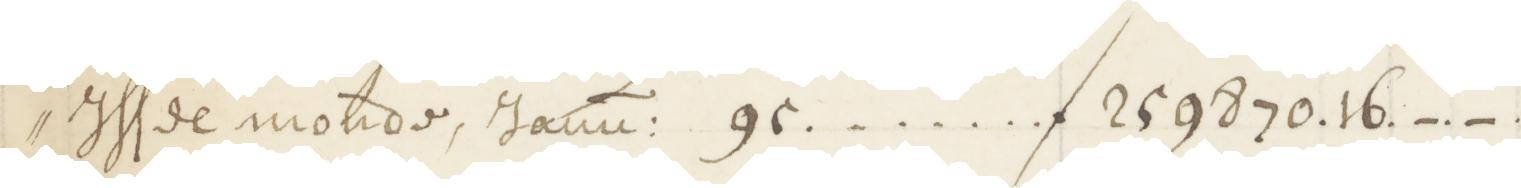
„ Issel monde, Jann: 95 . . . . . . . ƒ 259870.16. -.-.
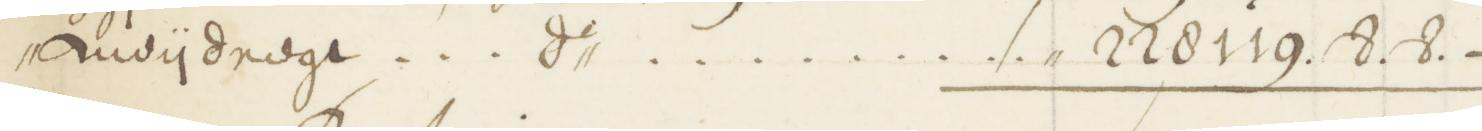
„ meijdregt . . . d„o . . . . . . . . . „ 228119.8.8.-
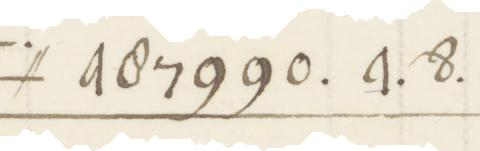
„ 487990.4.8.
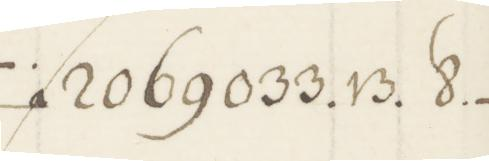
ƒ2069033.13. 8.
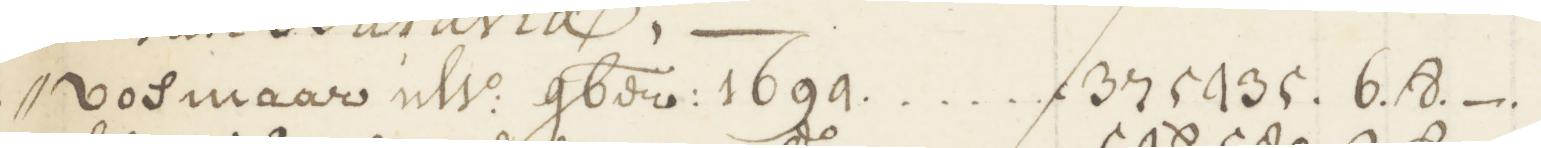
„ vosmaar ult:o 9ber: 1694 . . . . . ƒ375435.6.8.-.
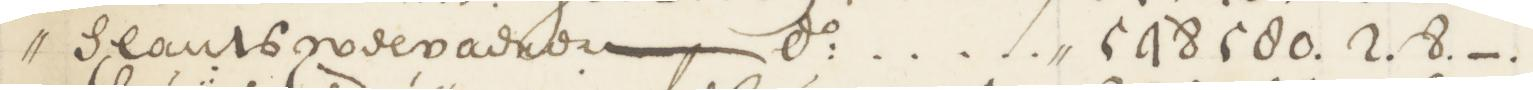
„ slants welvaeren d:o . . . . . „ 548580.2.8.-.
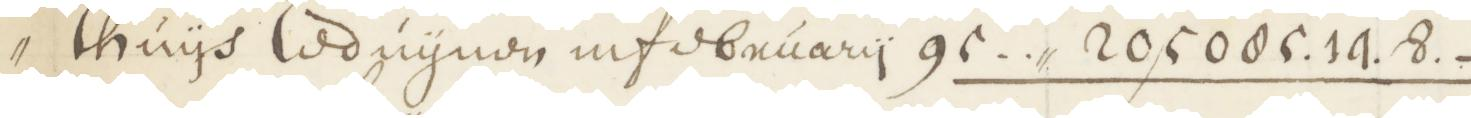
„ thuijs teduijnen in februarij 95 . . „ 205085.14.8.-.
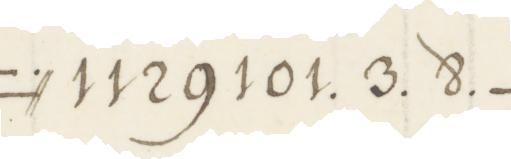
-.„ 1129101.3.8.-
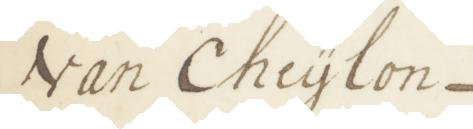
Van Cheijlon
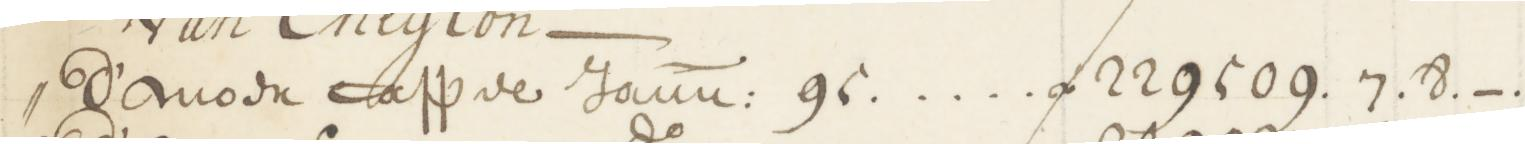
„ d'moer cappel Jann: 95 . . . . . ƒ229509.7.8.-.
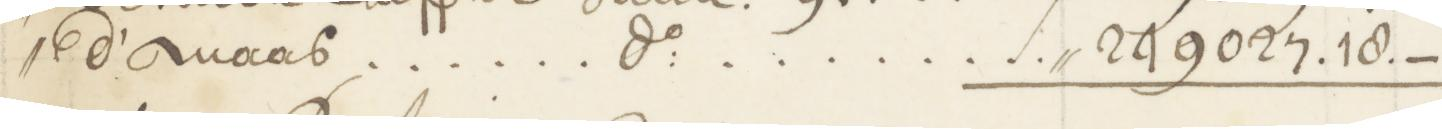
d' maas . . . . . . d:o . . . . . . . . „249027.18.-
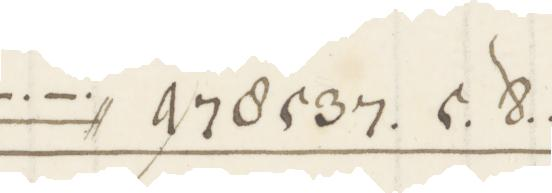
.-.„ 478537.5.8.
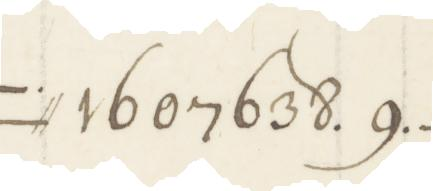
-.„ 1607638.9.
